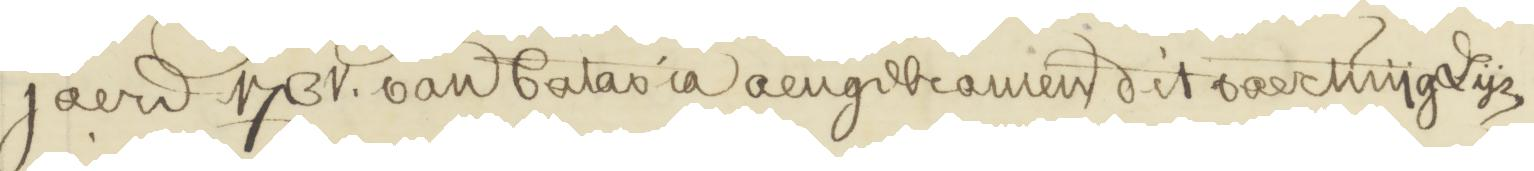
jaere 1731. van batavia aengekomen dit vaertuijg zijn
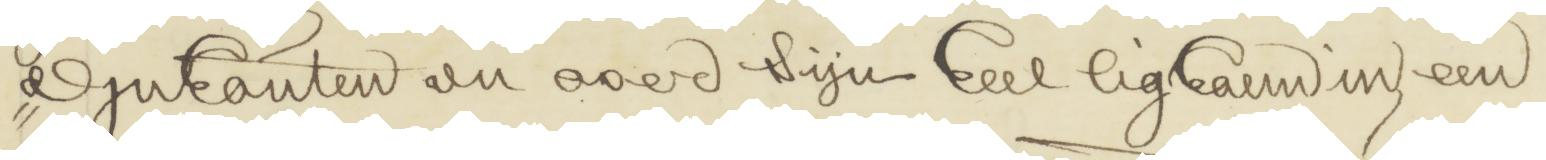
„de jnhouten en over sijn heel lighaem in een
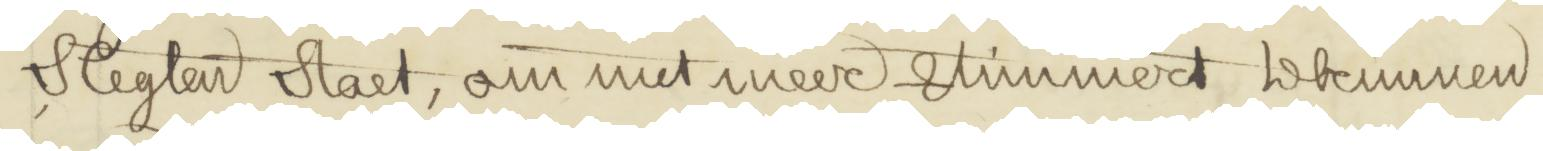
slegten staet, om niet meer vertimmert te kunnen
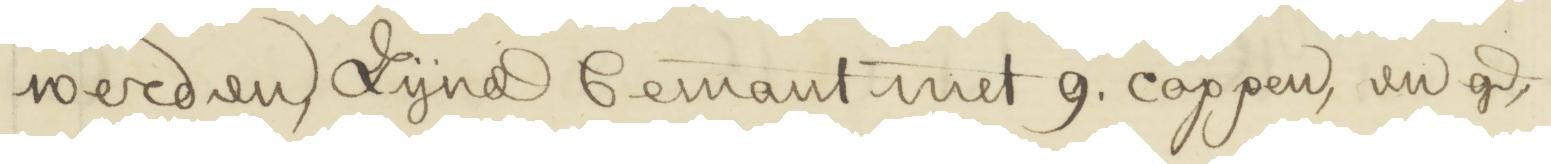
werden, zijnde bemant met 9. coppen, en ge,
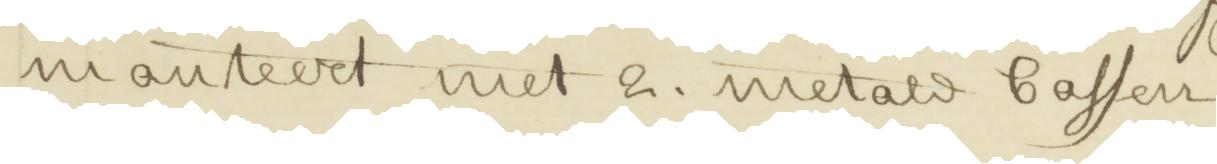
monteert met 2. metale bossen
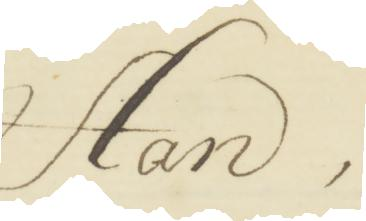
Aan,
